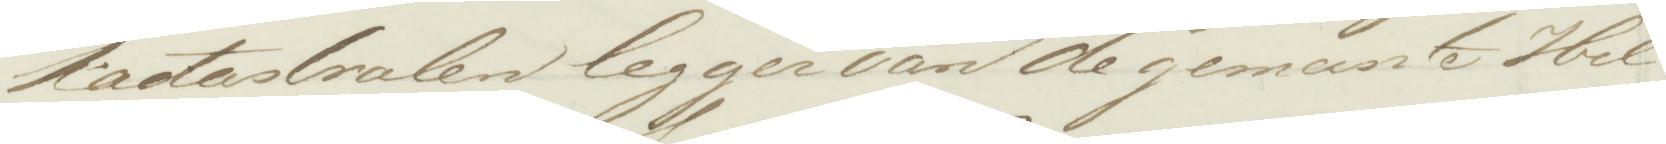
Kadastralen legger van de gemeente Hil
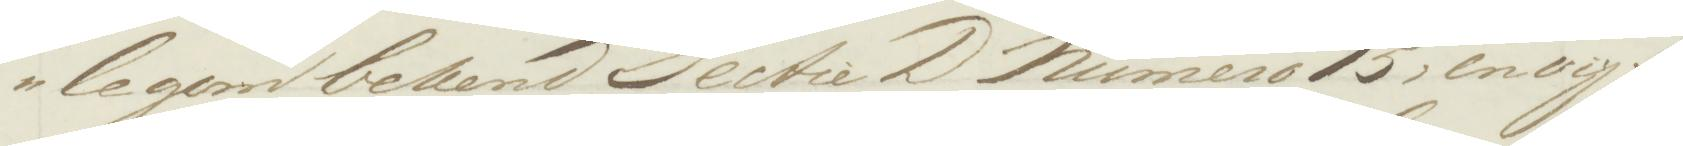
„legom bekend Sectie D Numero 15; en vijf
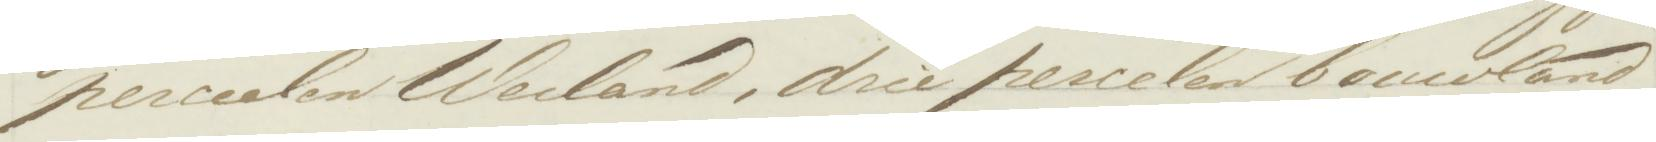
perceelen Weiland, drie percelen bouwland
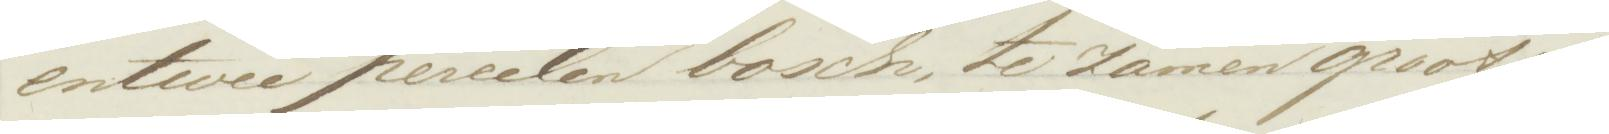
en twee pereelen bosch, te zamen groot vijf
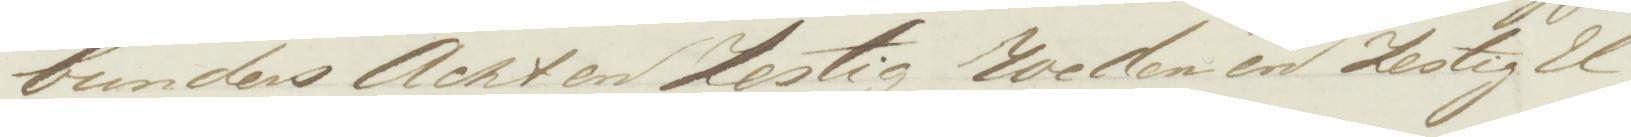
bunders Acht en Zestig Roeden en Zestig El
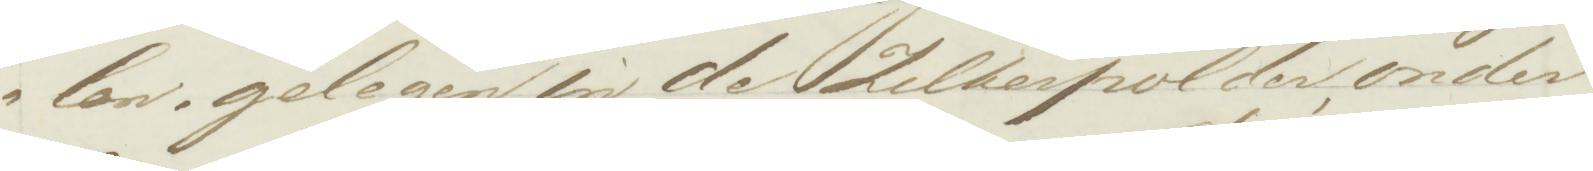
„len, gelegen in de Zilkerpolder, onder
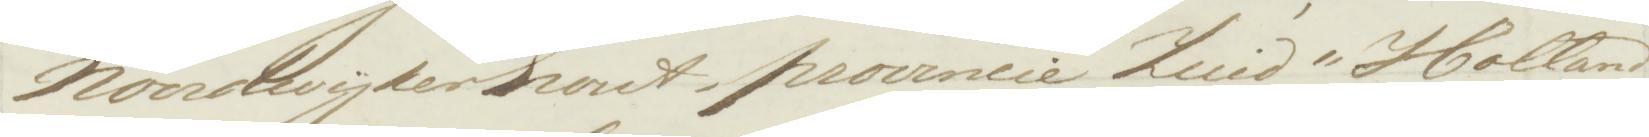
Noordwijkerhout, provincie Zuid " Holland,
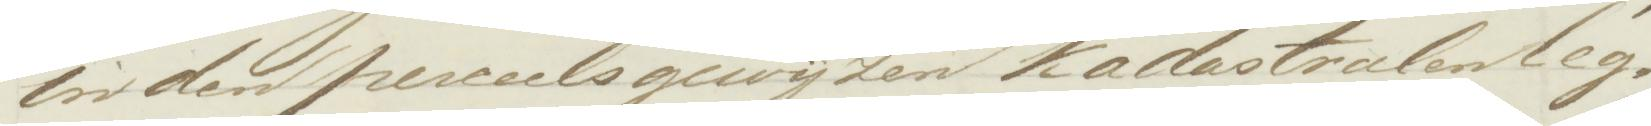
in den perceels gewijzen kadastralen leg„
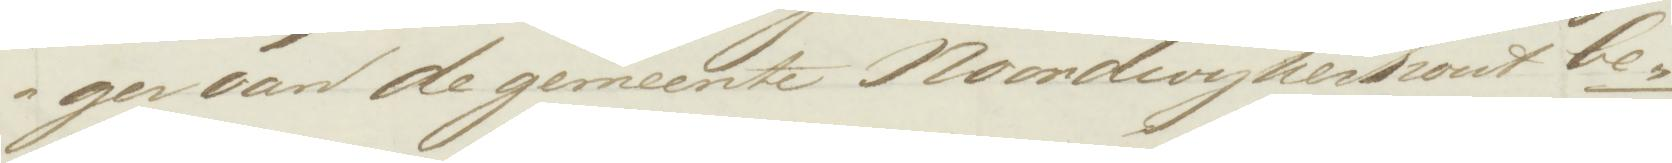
„ger van de gemeente Noordwykerhout be„
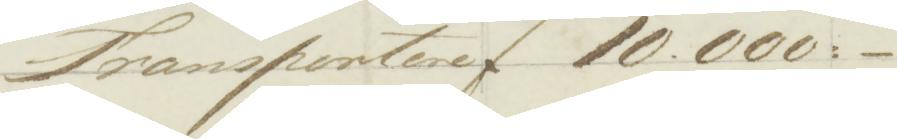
Transportere ƒ 10.000: —
